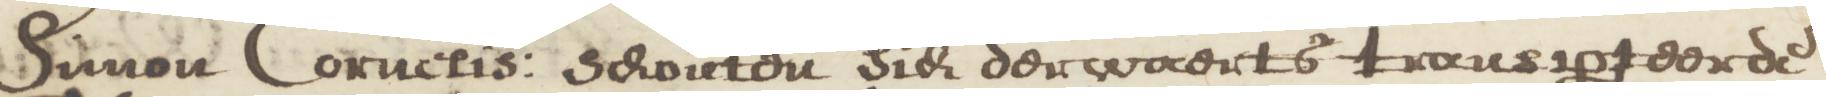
Simon Cornelis: schouten sich derwaerts transpteerde
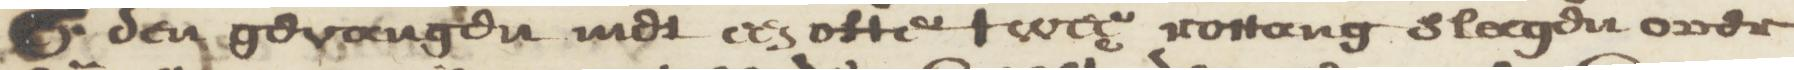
ende den gevangen met een ofte twee rottang sloegen over
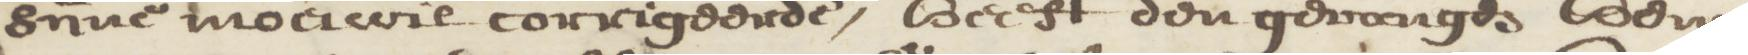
sijne moetwil corrigeerde, heeft den gevangen hem
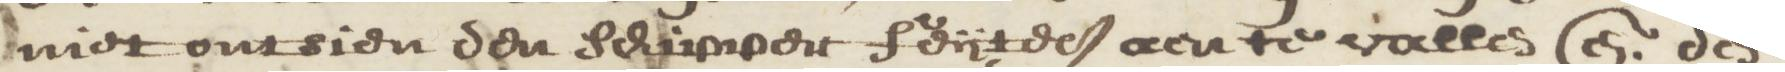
niet ontsien den schipper feijtdelijk aen te vallen ende den
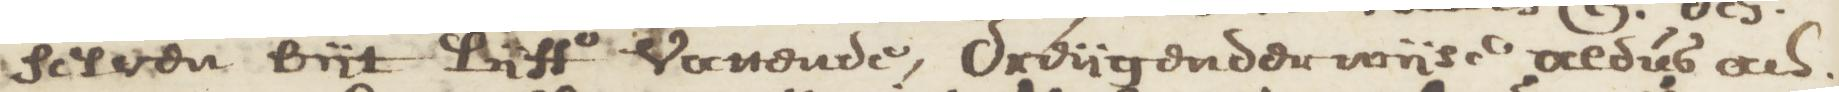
selven bijt Lijff vattende, dreijgenderwijse aldus aen
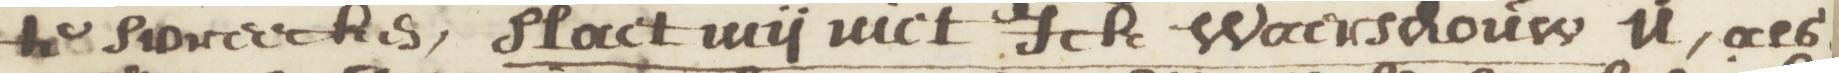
te spreecken, slaet mij niet Ick waerschouw u, als
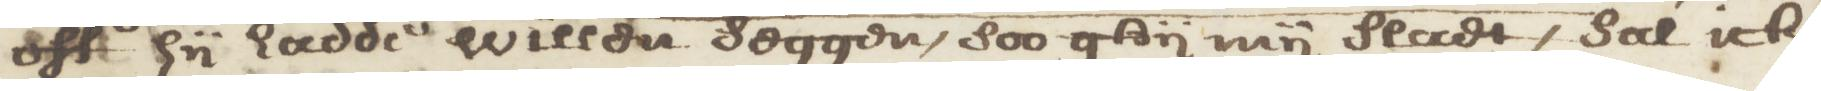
off hij hadde willen seggen, soo ghij mij slaet, sal ick
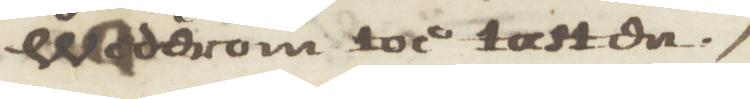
wederom toe tasten.
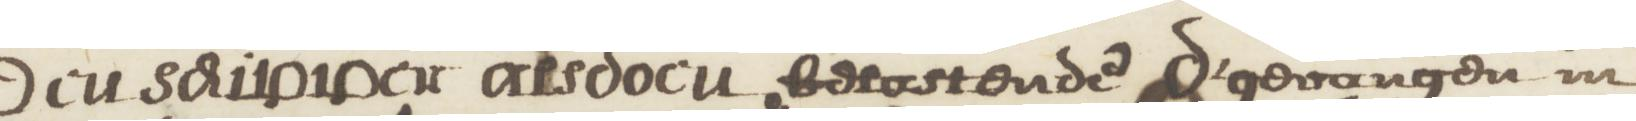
Den schippper alsdoen, belastende d'gevangen in
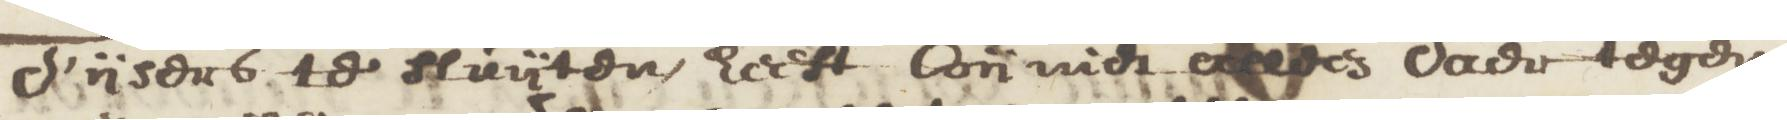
d'ijsers te sluijten, heeft hij niet aaden daer tegen
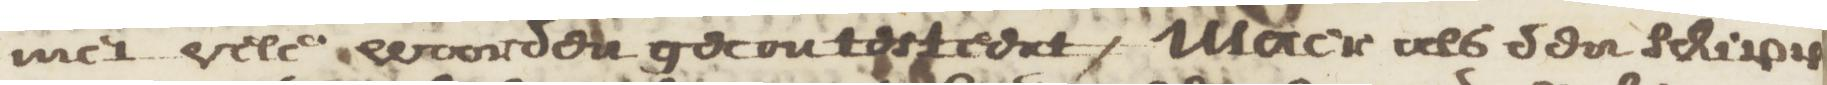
met vele woorden gecontesteert, maer als den schipp
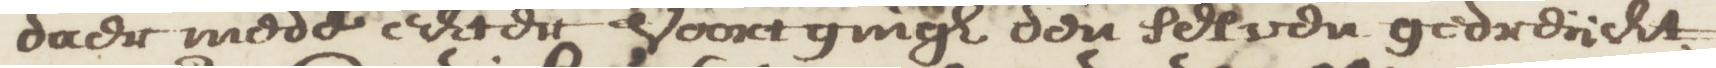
daer mede echter voorgingh den selven gedreijcht
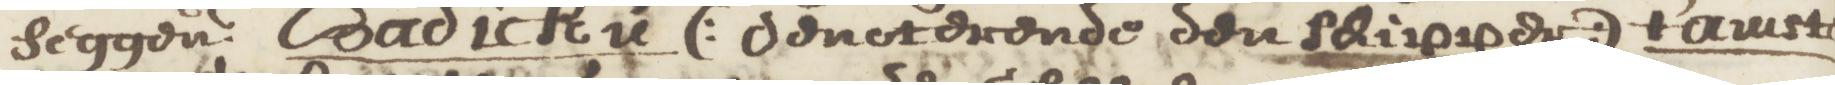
seggen, Bad ick u (: denoterende den schipper :) t'amst
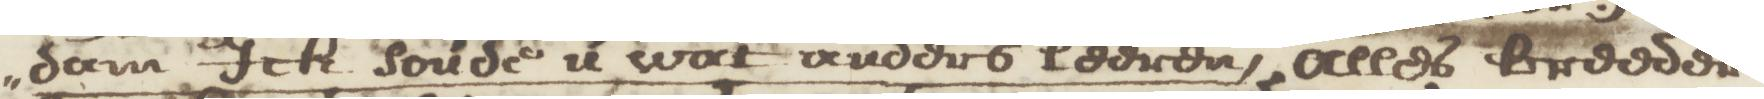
„dam Ick soude u wat anders leeren, alles breeder
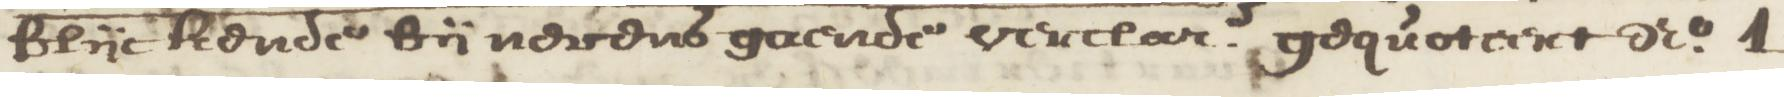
blijckende bij nevens gaende verclar.-e gequoteert n.o 1
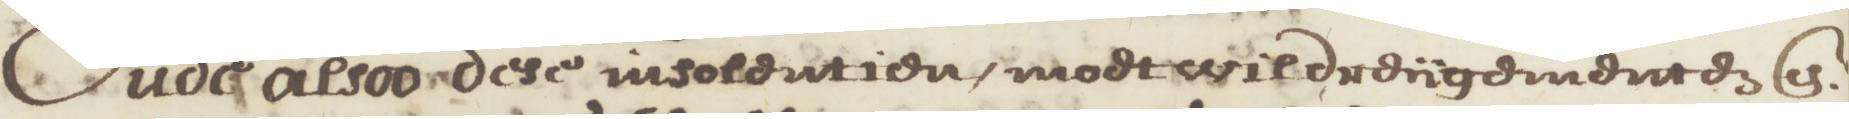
Ende alsoo dese insolentien,, moetwil dreijgementen ende
